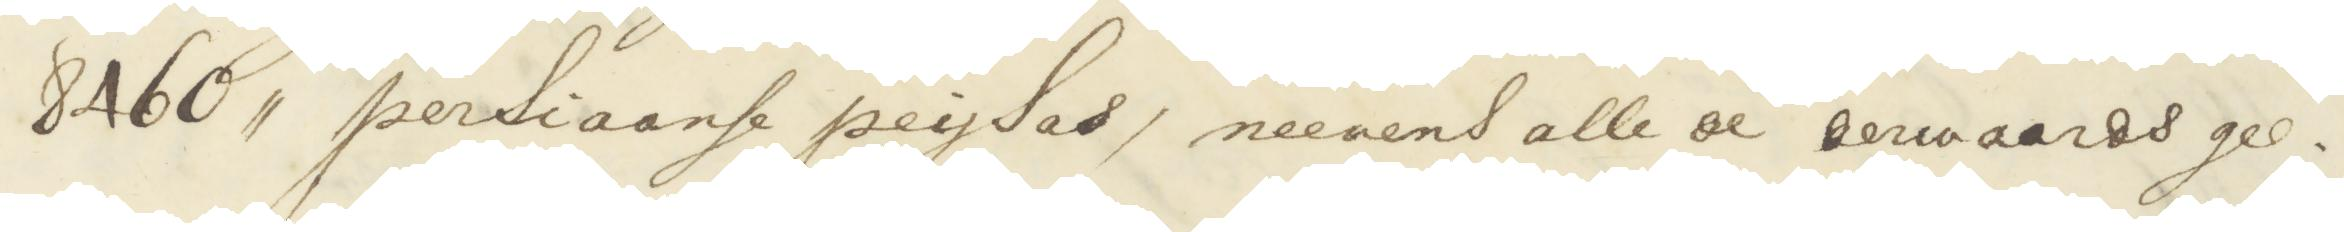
8460 „ persiaanse peijsas, neevens alle de derwaards ge.
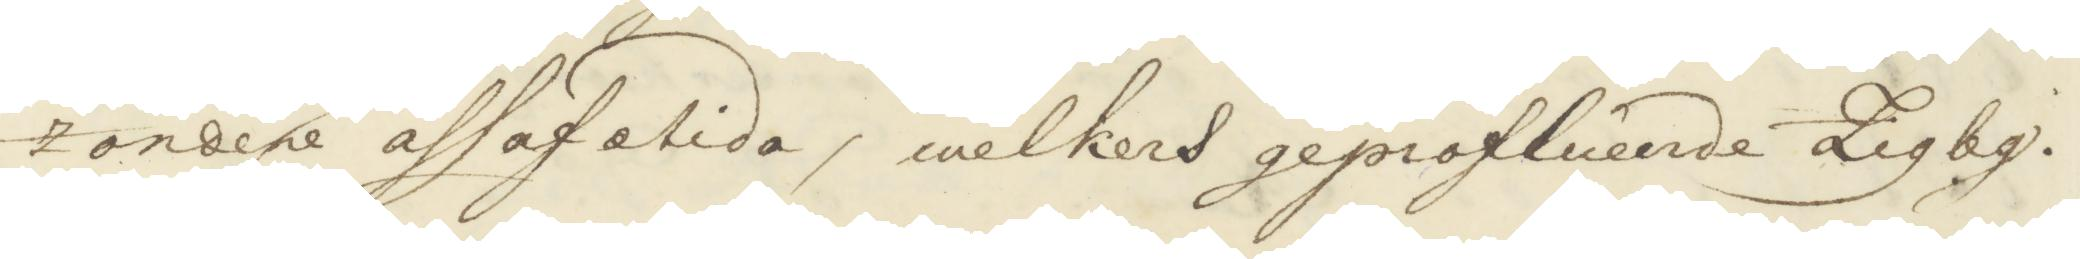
zondene assafatida, welkers geproflueerde zigbg.
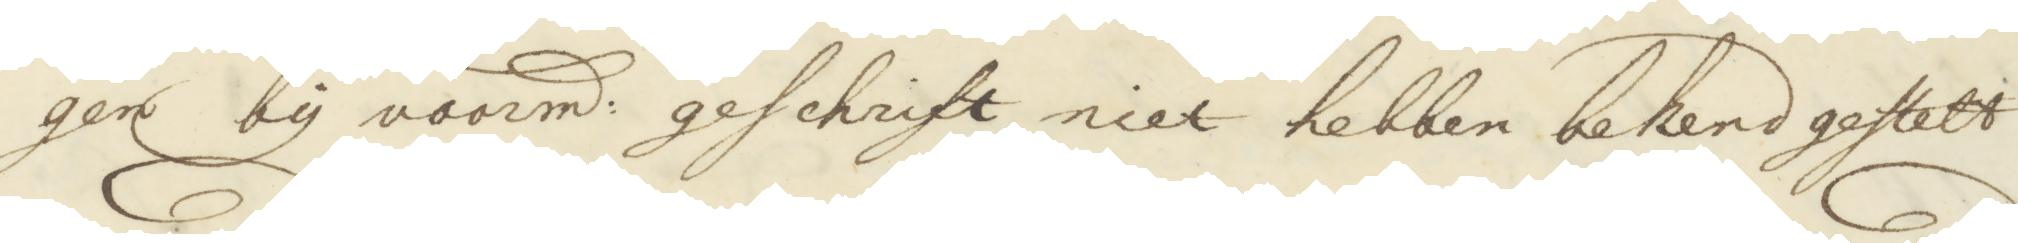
gen bij voorm: geschrift niet hebben bekend gestelt
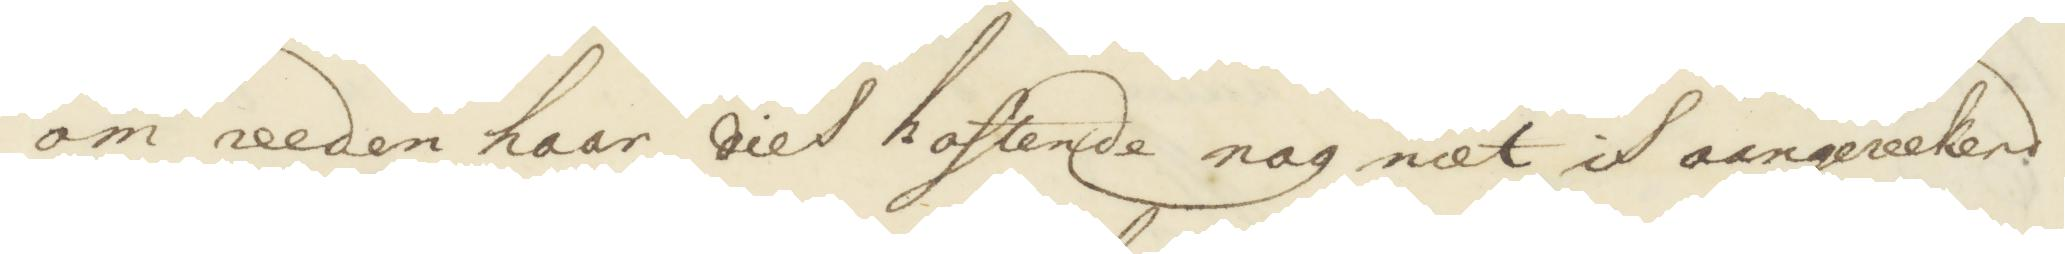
om reeden haar dies kostende nog niet is aangereekend
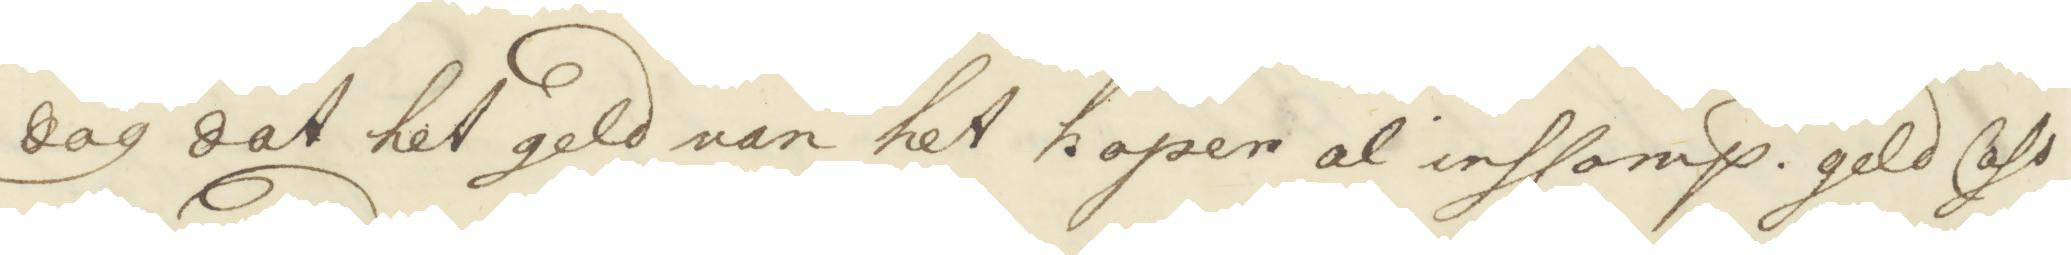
dog dat het geld van het koper al in sComp.s geld Cass
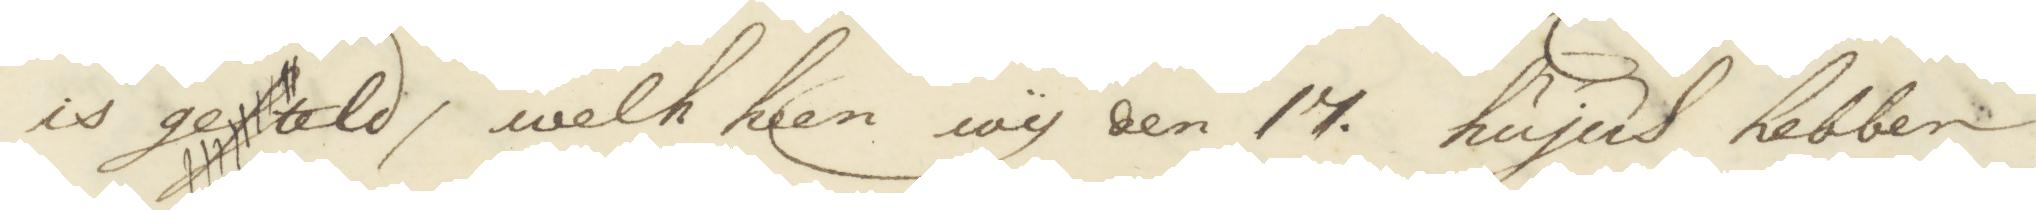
is gesteld, welk heen wij den 17. hujus hebben
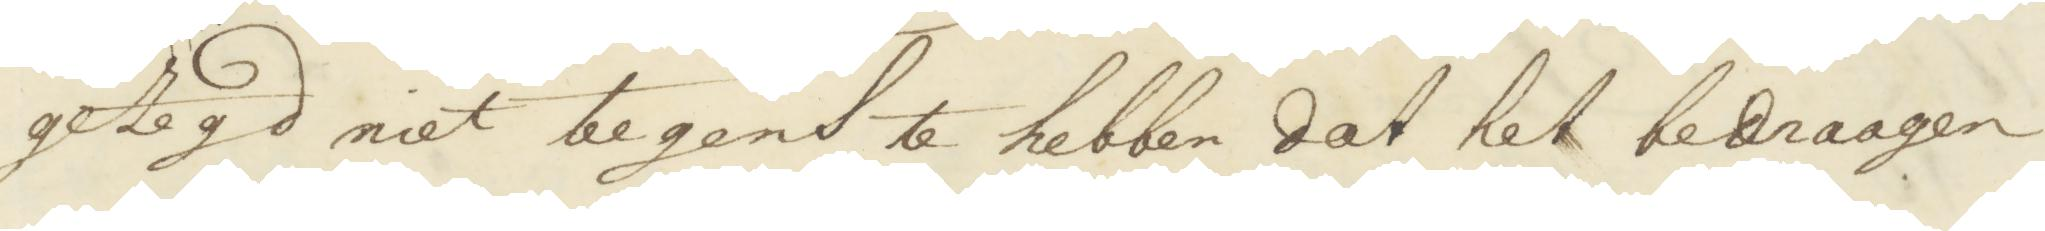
gezegd niet teegens te hebben dat het bedraagen
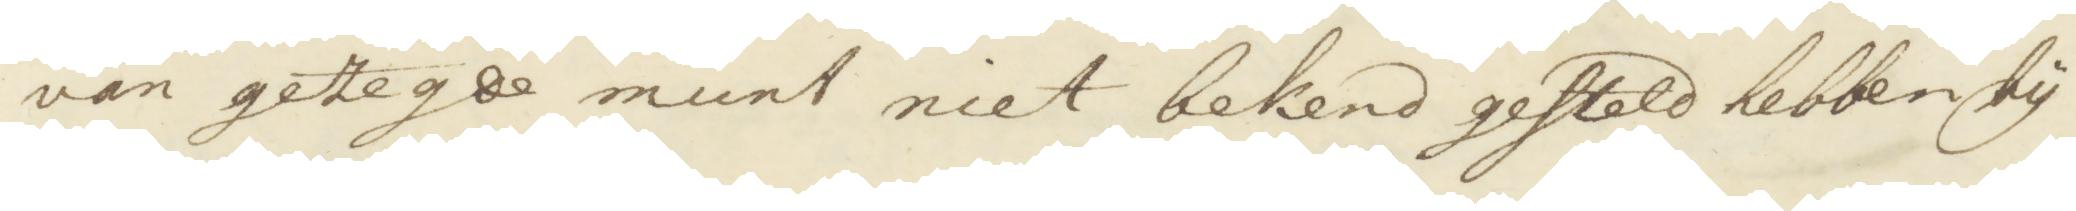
van gezegde munt niet bekend gesteld hebben bij
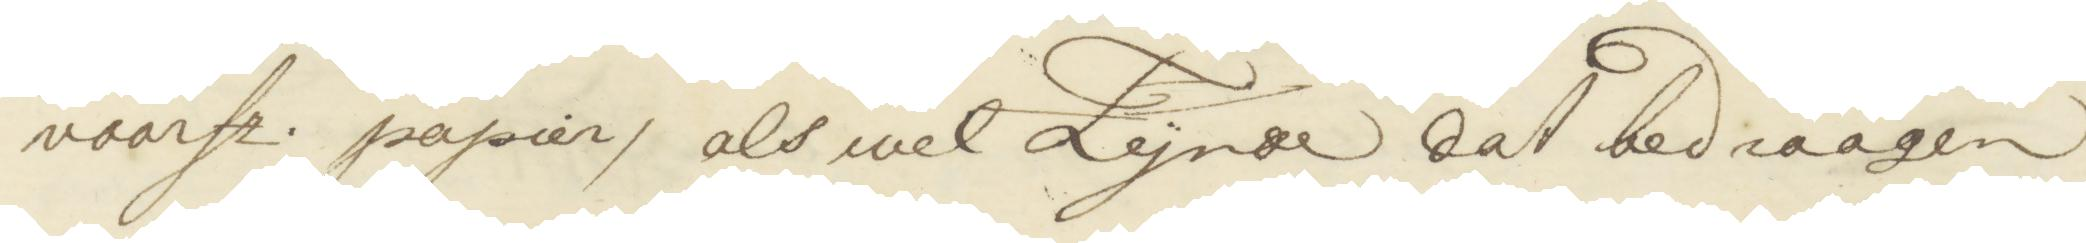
voorsz: papier, als wel zijnde dat bedraagen
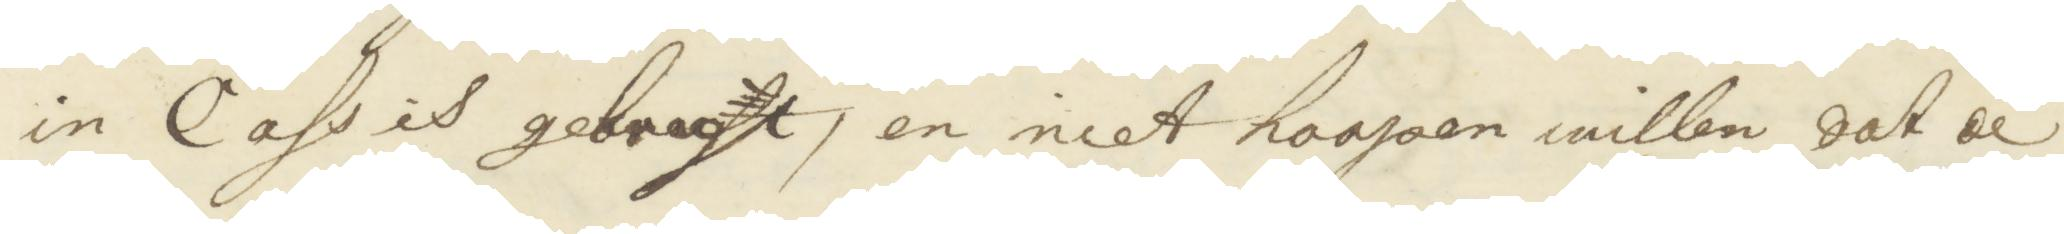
in Cass is gebragt, en niet hoopen willen dat de
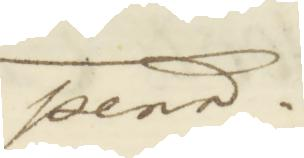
penn.
